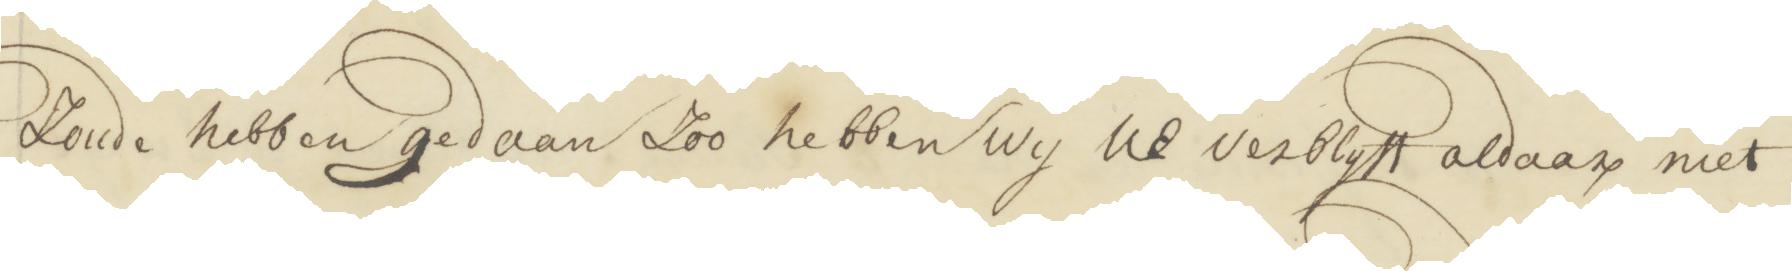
zoude hebben gedaan zoo hebben wy UE verblyff aldaar niet
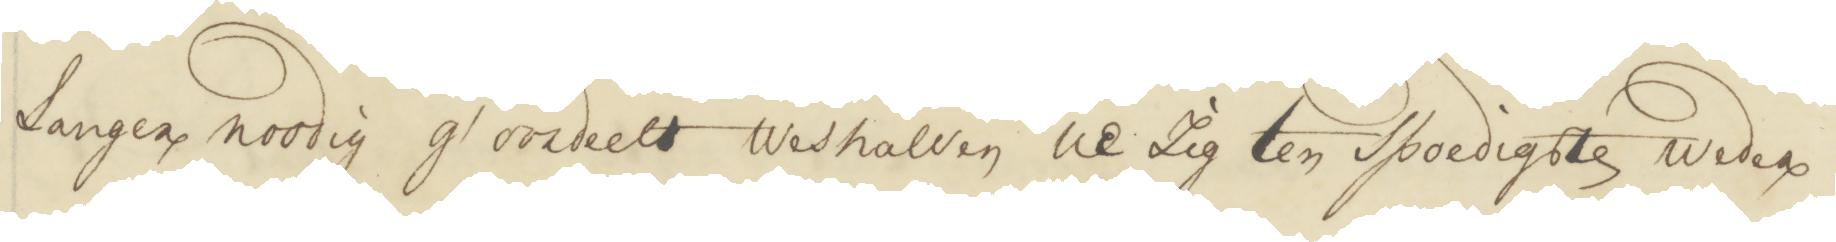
langer noodig g’oordeelt weshalven UE zig ten spoedigsten weder
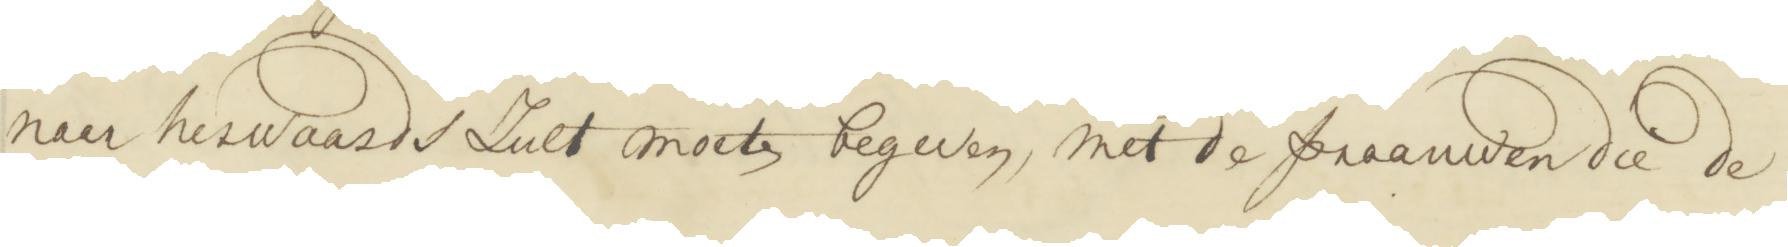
naar herwaards zult moeten begeven, met de praauwen die de
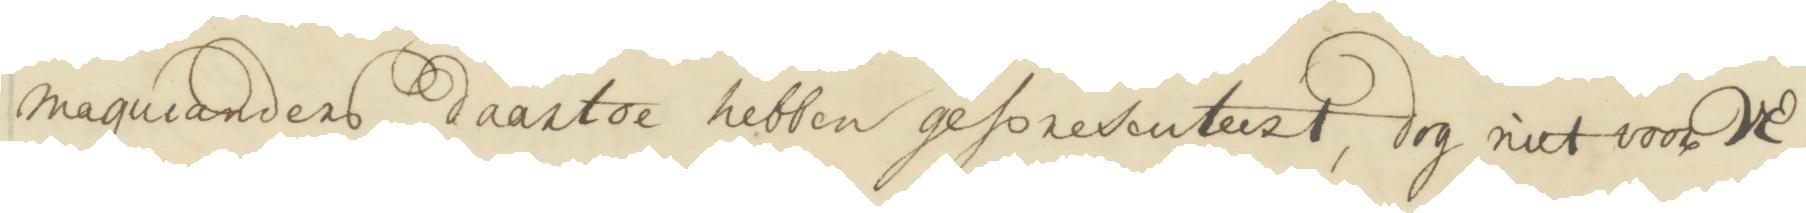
maquianders daartoe hebben gepresenteert, dog niet voor VE
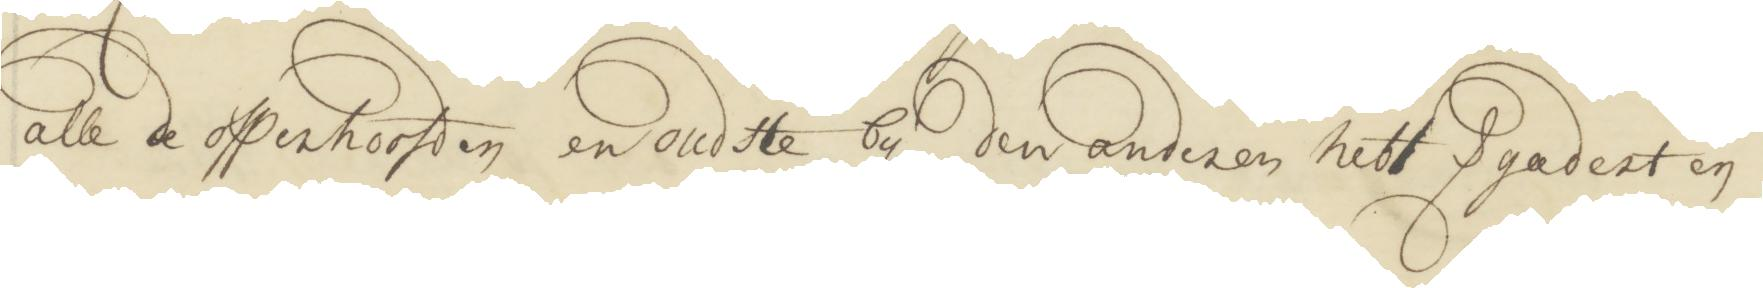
alle de opperhoofden en oudste by den anderen hebt vergadert en
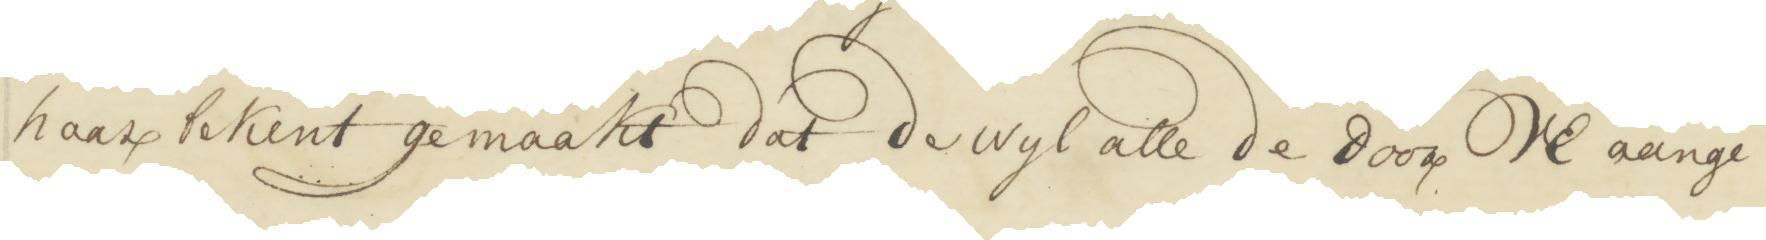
haar bekent gemaakt dat de wyl alle de door VE aange
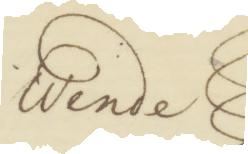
wende
